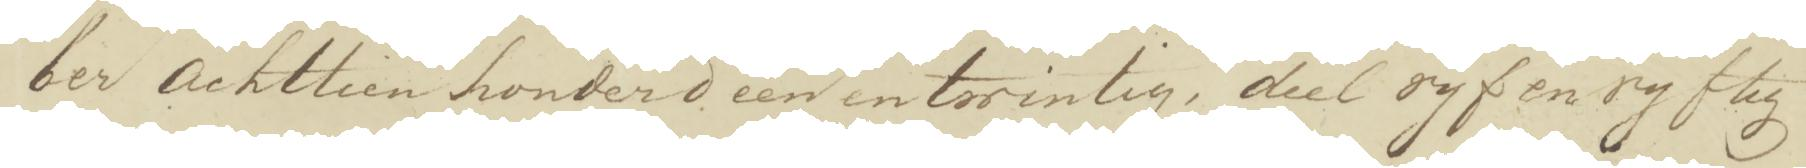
ber achttien honderd een en twintig, deel vijf en vijftig
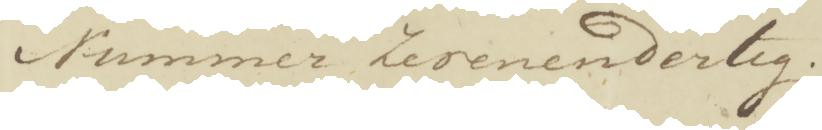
Nummer zevenendertig
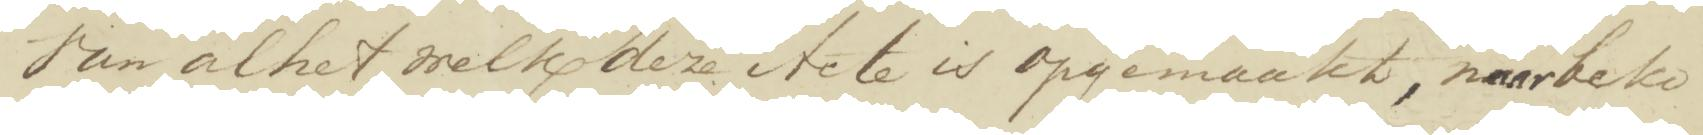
Van al het welk deze Acte is opgemaakt, naar beko
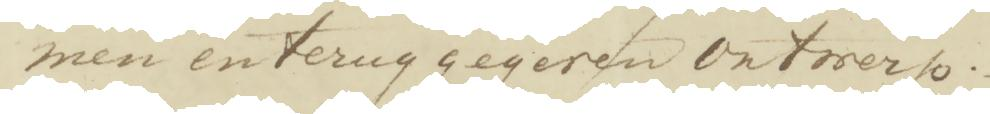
men en terug gegeven ontwerp.
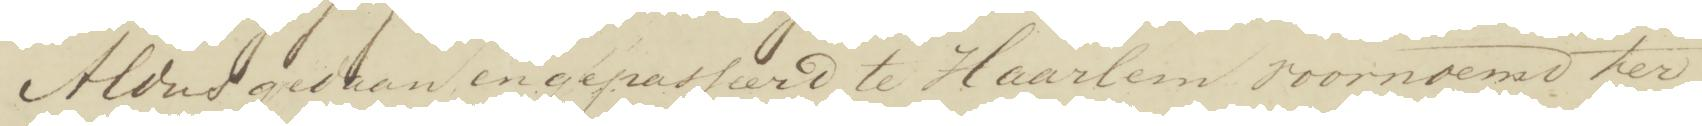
Aldus gedaan, en gepasseerd te Haarlem voornoemd ter
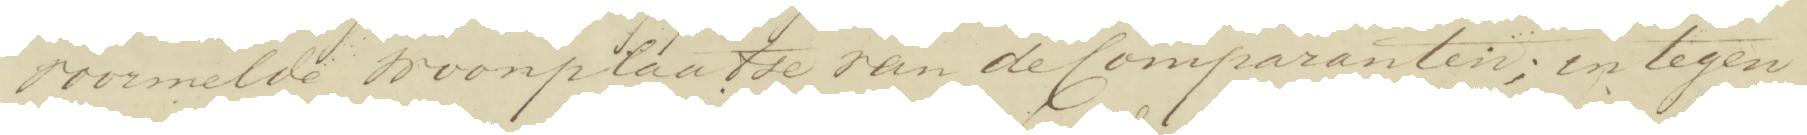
voormelde woonplaatse van de Comparanten; in tegen
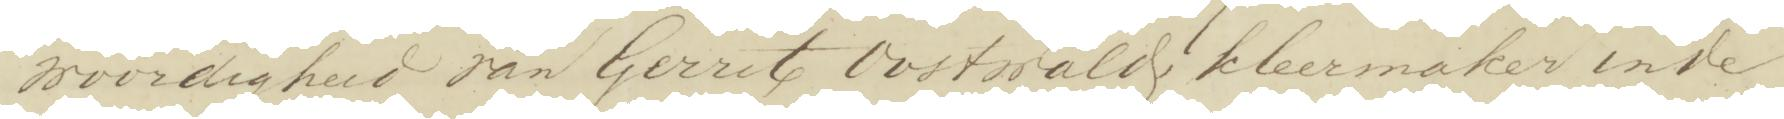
woordigheid van Gerrit Oostwald, kleermaker in de
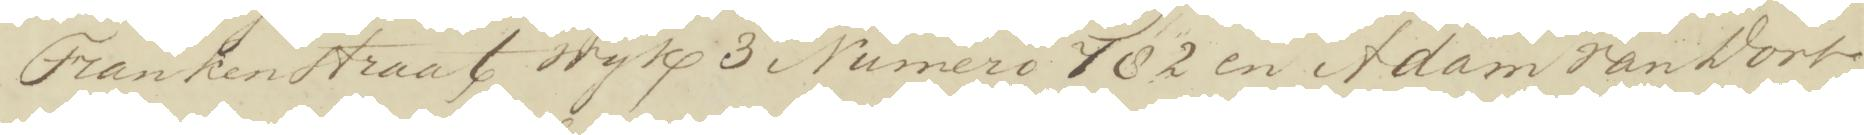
Frankenstraat wijk 3 Numero 782 en Adam van Dort
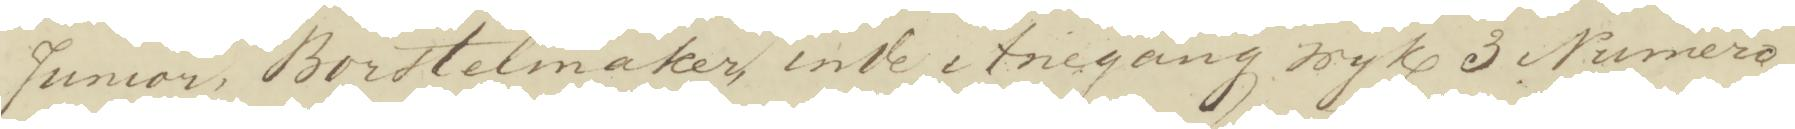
Junior, Borstelmaker, in de Anegang wijk 3 Numero
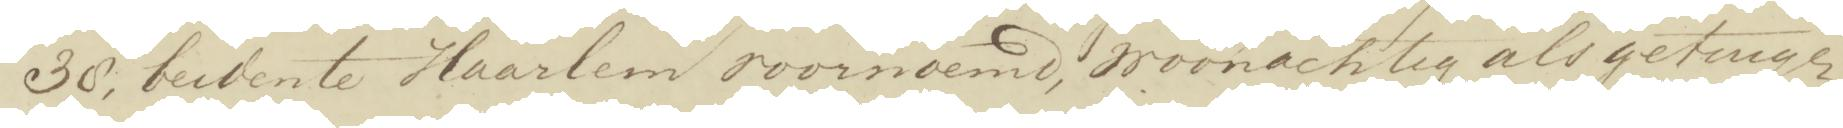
38; beiden te Haarlem voornoemd, woonachtig als getuigen
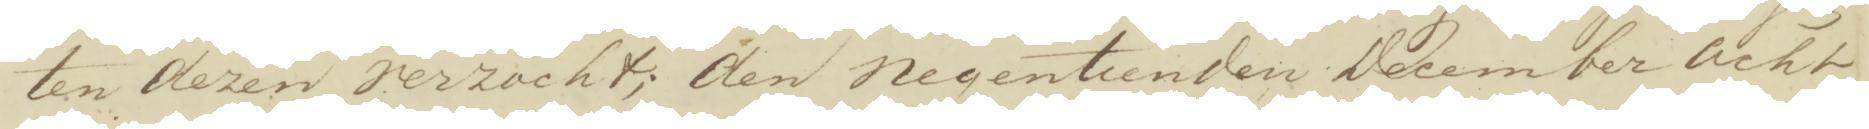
ten dezen verzocht, den negentienden December acht
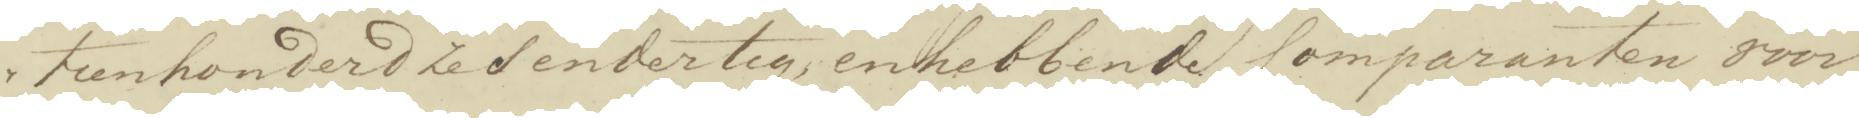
tienhonderd zes endertig, en hebben de Comparanten voor
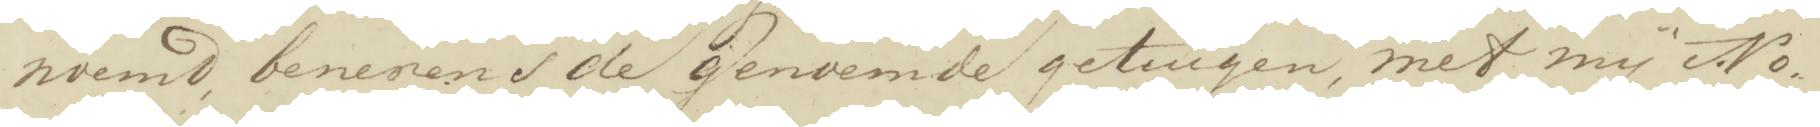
noemd, benevens de genoemde getuigen, met mij No„
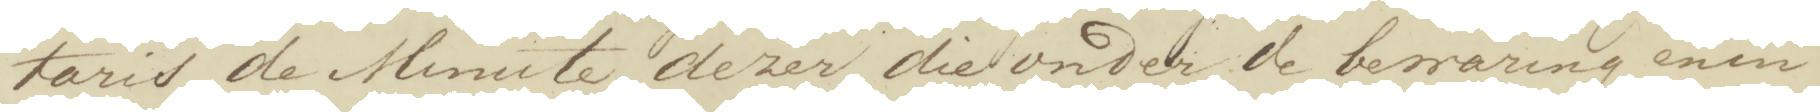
taris de Minute dezer, die onder de bewaring en in
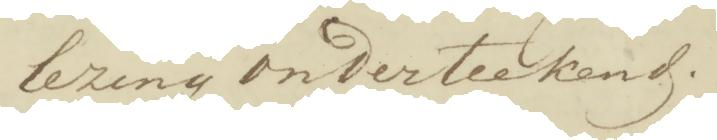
lezing onderteekend.
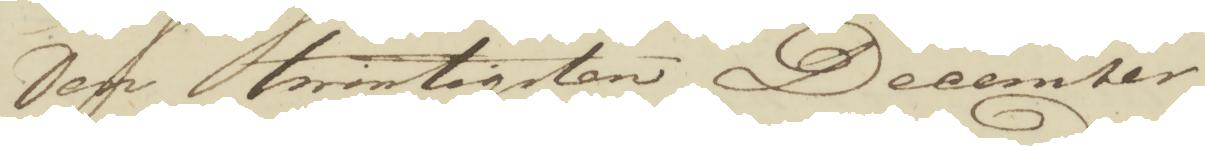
den twintigsten December
